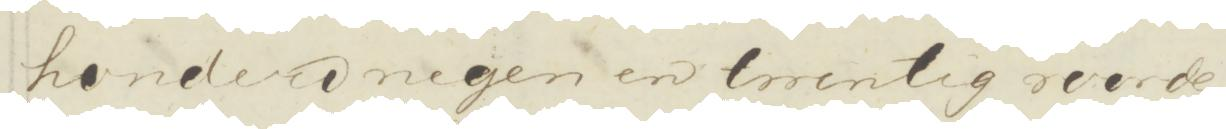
honderd negen en twintig voor den
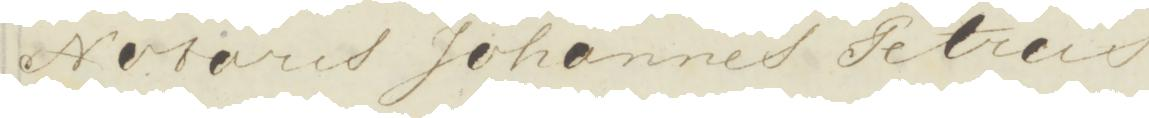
Notaris Johannes Petrus
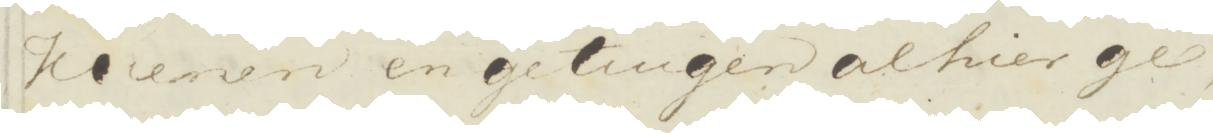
Kuenen en getuigen alhier ge,
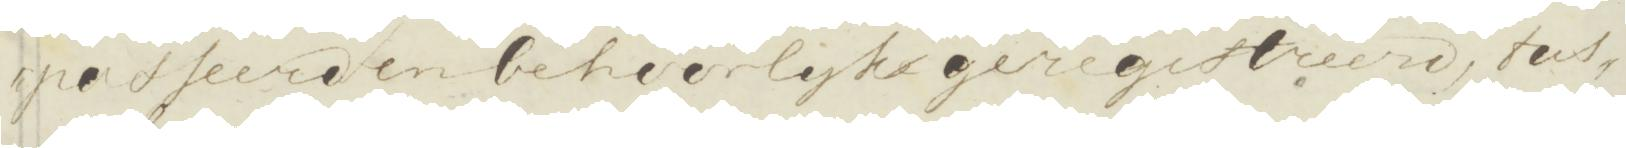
passeerd en behoorlyk geregistreerd, tus„
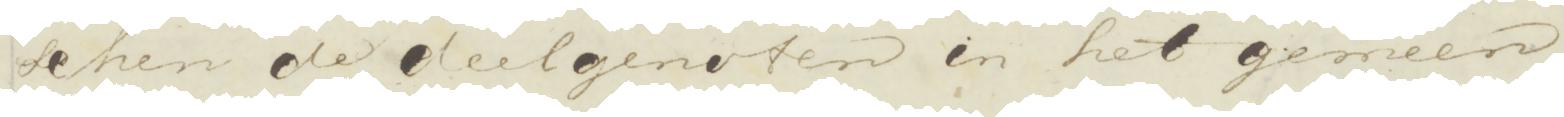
schen de deelgenoten in het gemeen
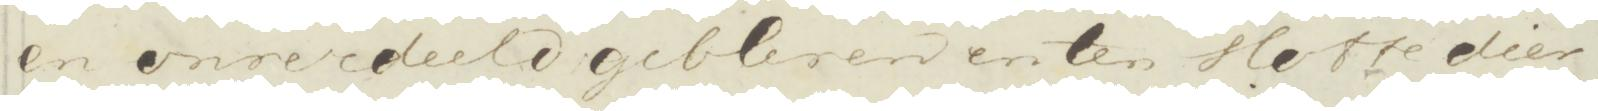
en onverdeeld gebleven en ten slotte dier
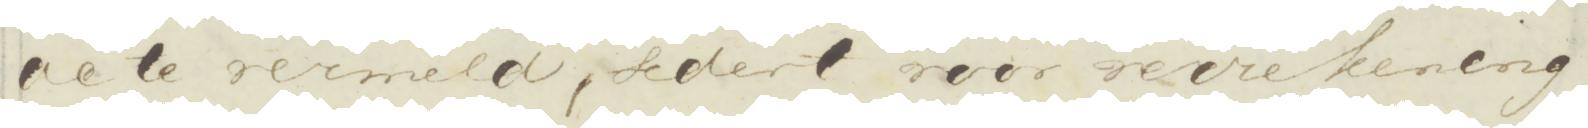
na te vermeld, sedert voor verrekening
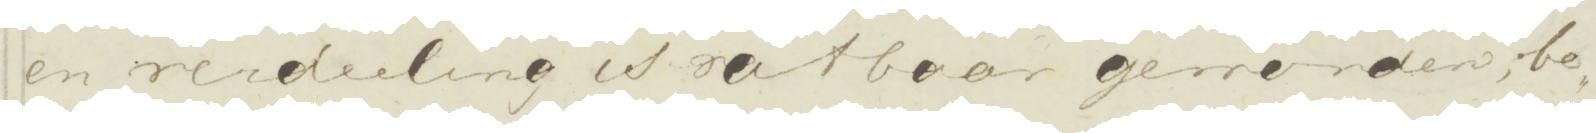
en verdeeling is vatbaar geworden, be„
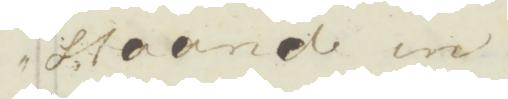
„staande in
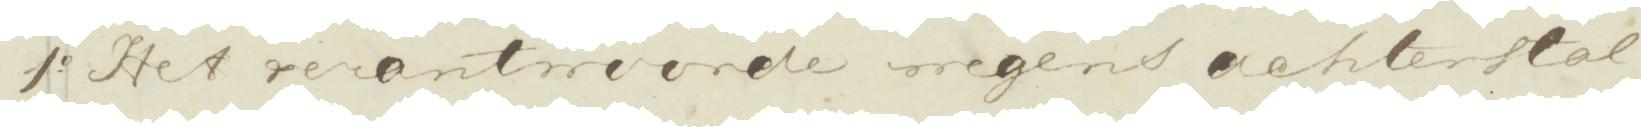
1-o Het verantwoorde wegens achterstal
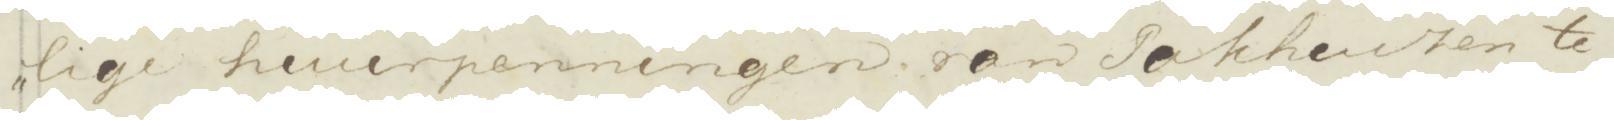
„lige huurpenningen van Pakhuizen te
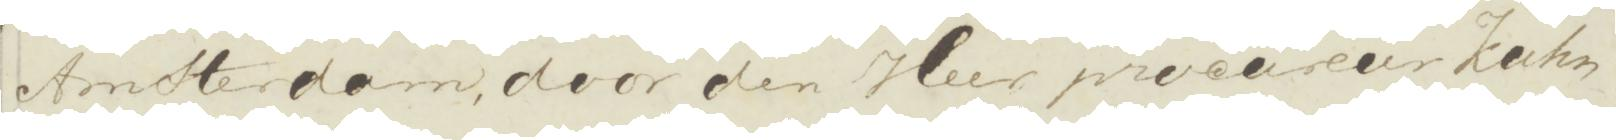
Amsterdam, door den Heer procureur Kahn
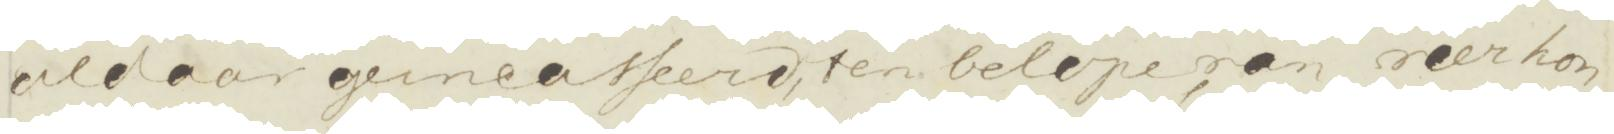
aldaar geincasseerd, ten belope van vierhon
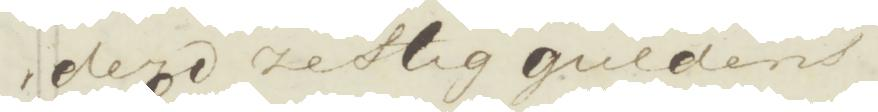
„derd zestig guldens – – –– ƒ 460:
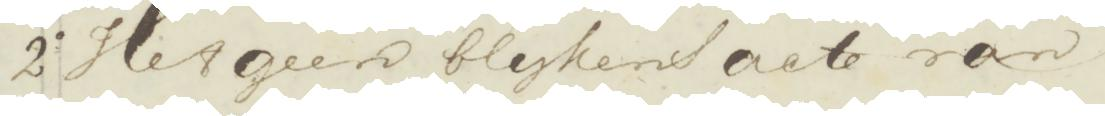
2=o Het geen blykens acte van
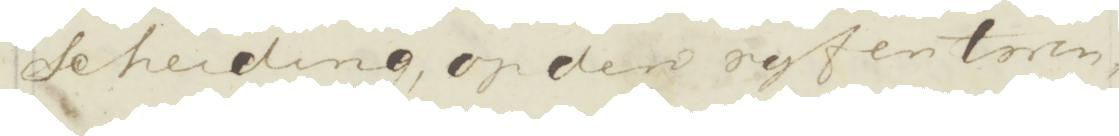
scheiding, op den vyf en twin,
